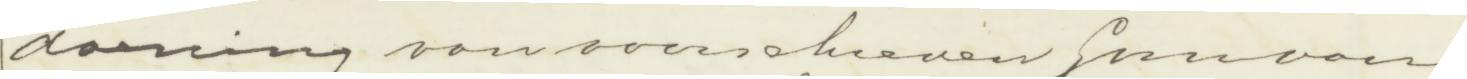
doening van voorschreven Som van
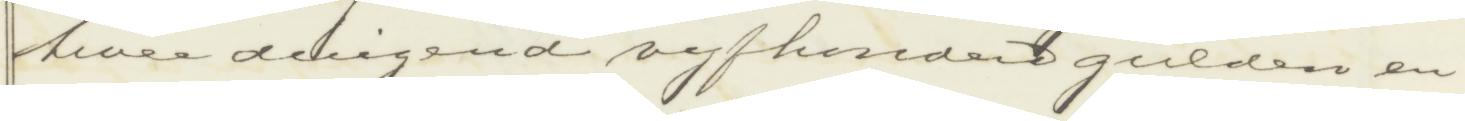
twee duizend vyfhonderd gulden en
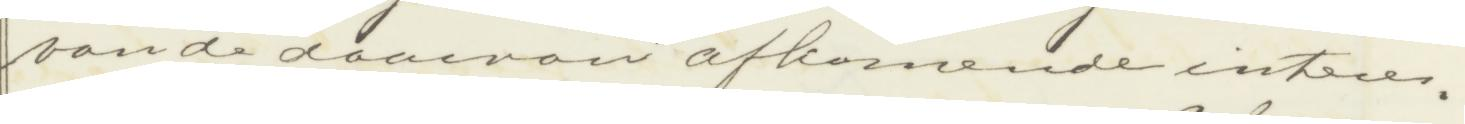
van de daarvan afkomende interes„
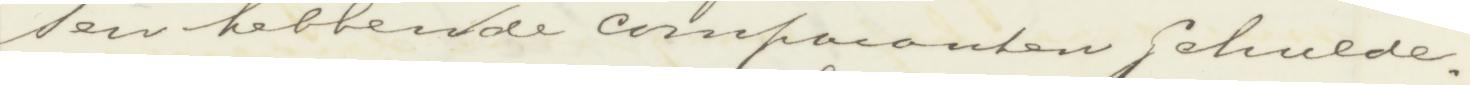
sen hebben de comparanten Schulde„
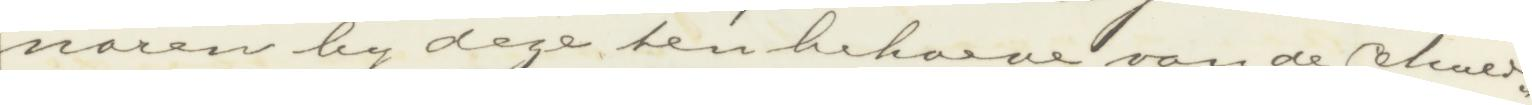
naren by deze, ten behoeve van de Schuld
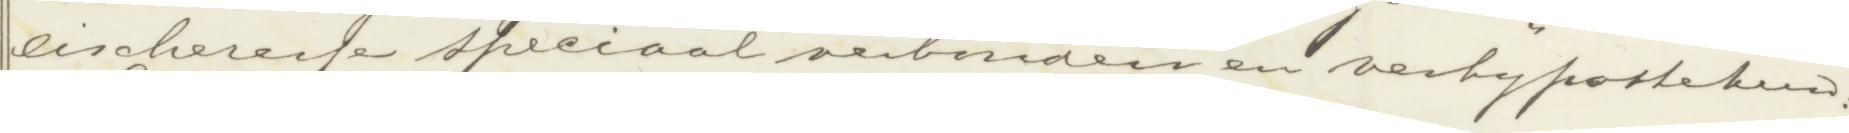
eischeresse speciaal verbonden en verhypothekeerd
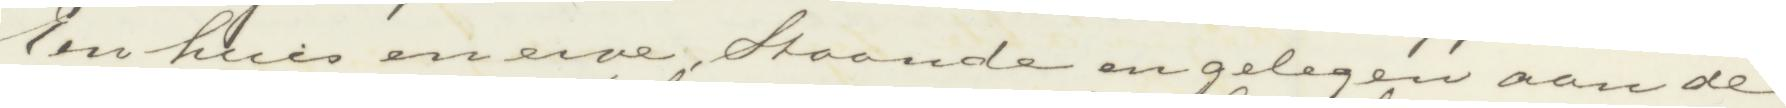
Een huis en erve, staande en gelegen aan de
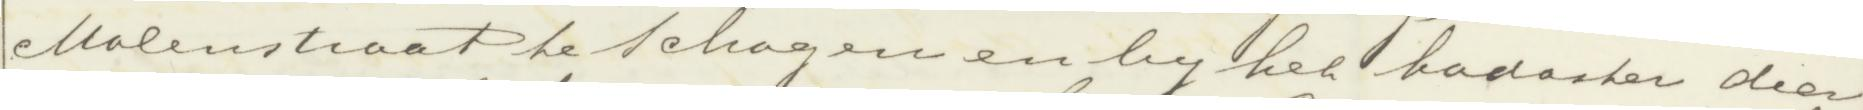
Molenstraat te schagen en by het kadaster dier
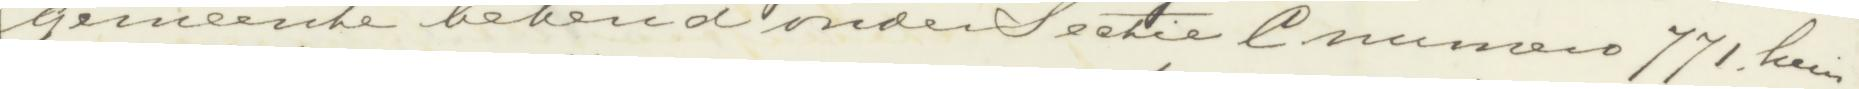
gemeente bekend onder sectie C numero 771, huis
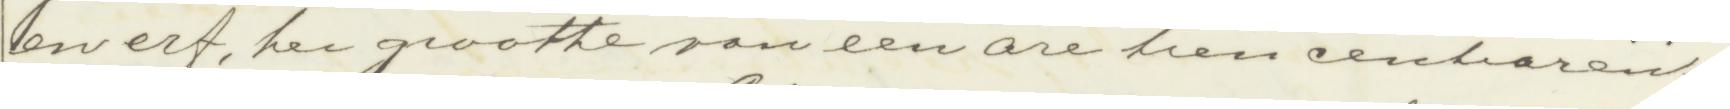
en erf, ter grootte van een are tien centiaren.-
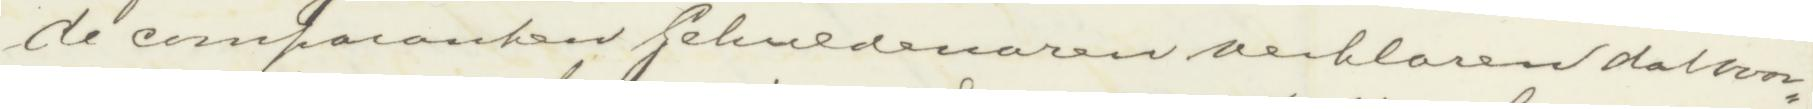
de comparanten Schuldenaren verklaren dat voor„
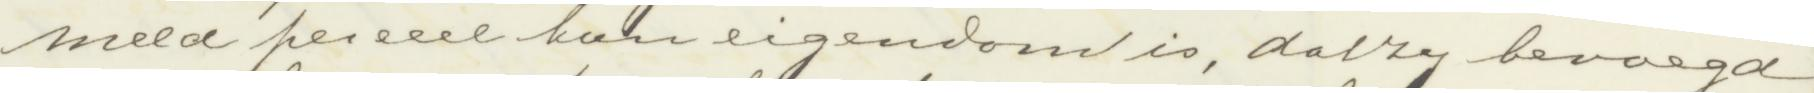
meld perceel hun eigendom is, dat zy bevoegd
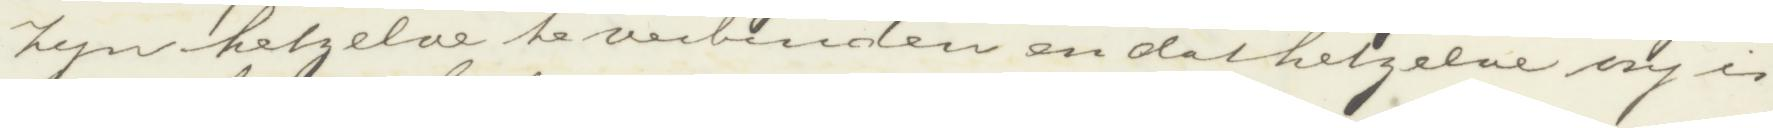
zyn hetzelve te verbinden en dat hetzelve vry is
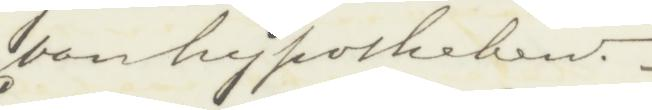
van hypotheken.
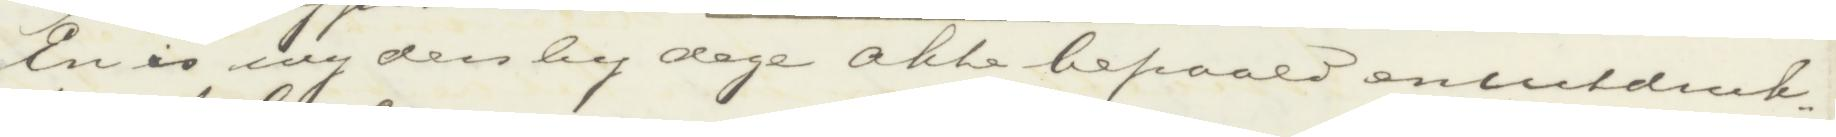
En is wyders by deze akte bepaald en uitdruk„
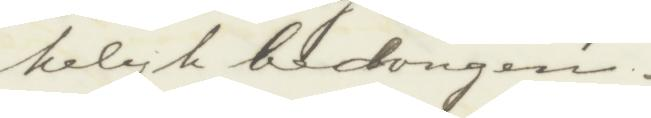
kelyk bedongen.
